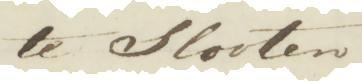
te Slooten
